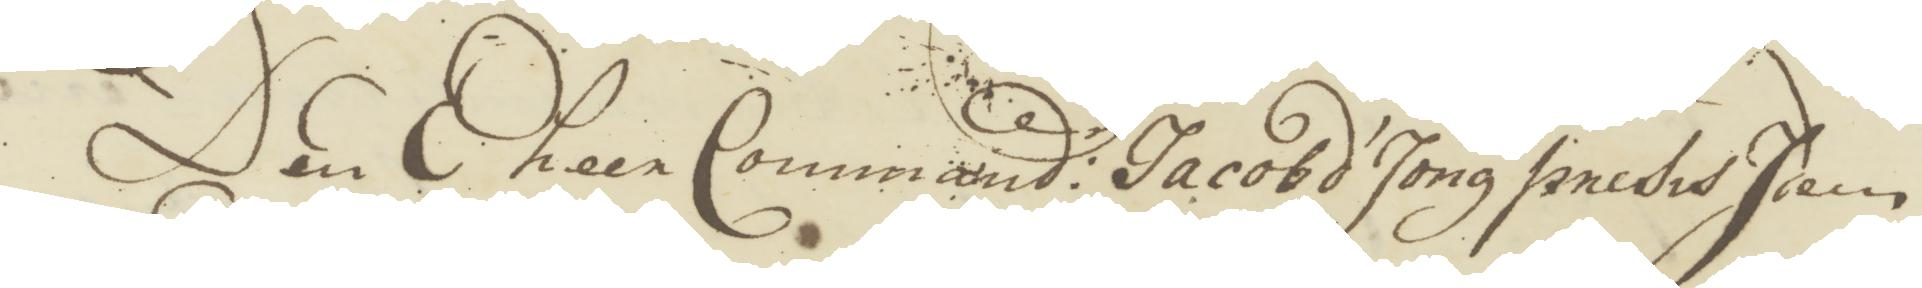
Den E heer Command:r Iacob d' Jong presis Jdem
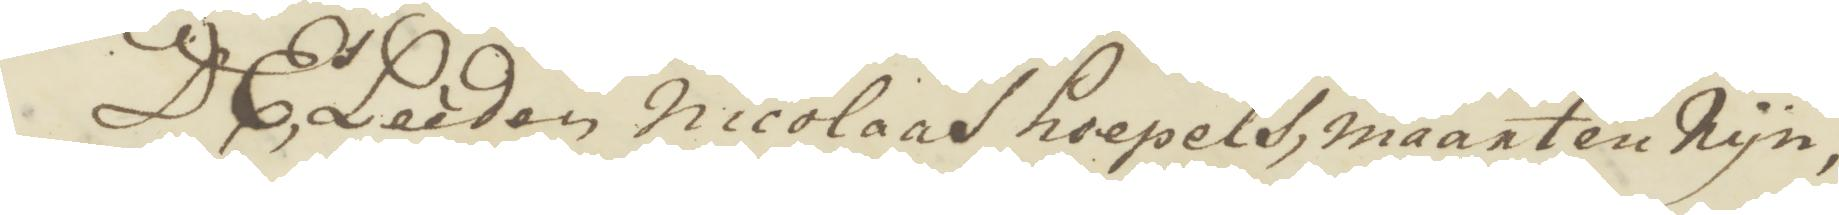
D, E,s Leeden nicolaas hoepels, maarten rijn,
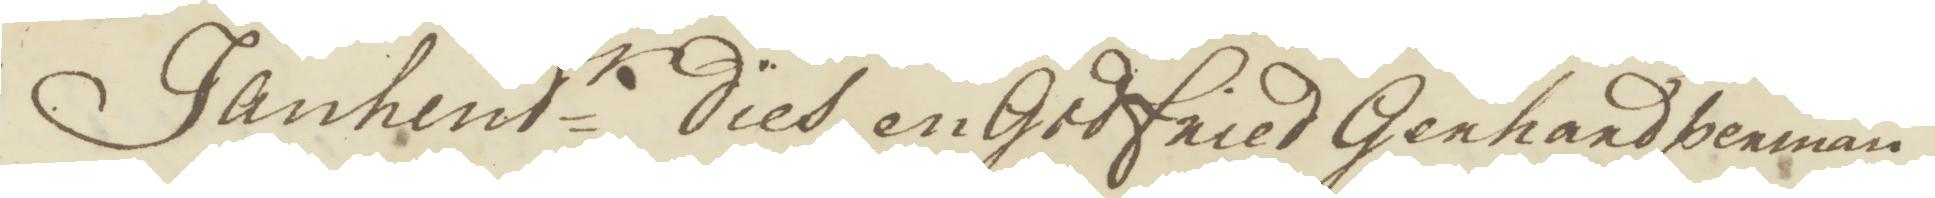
Jan hend=k dies, en Godfried Gerhard perman
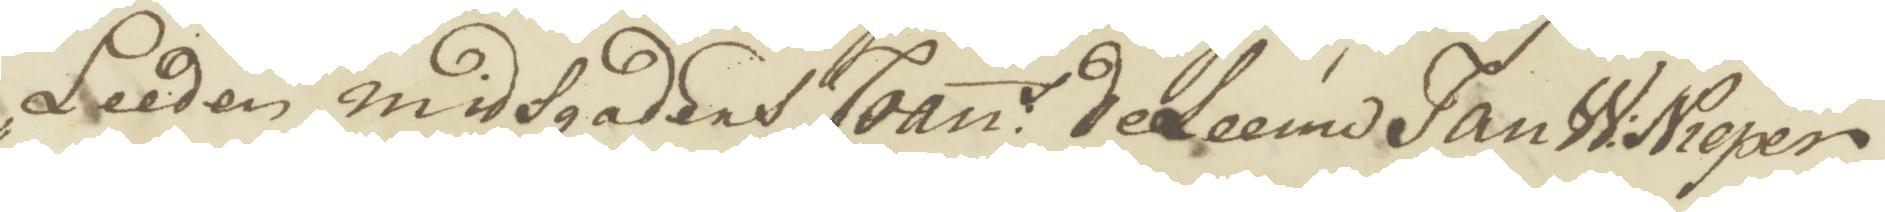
Leeden, midsgaders Joan:s de Leeuw Ian W: Nieper
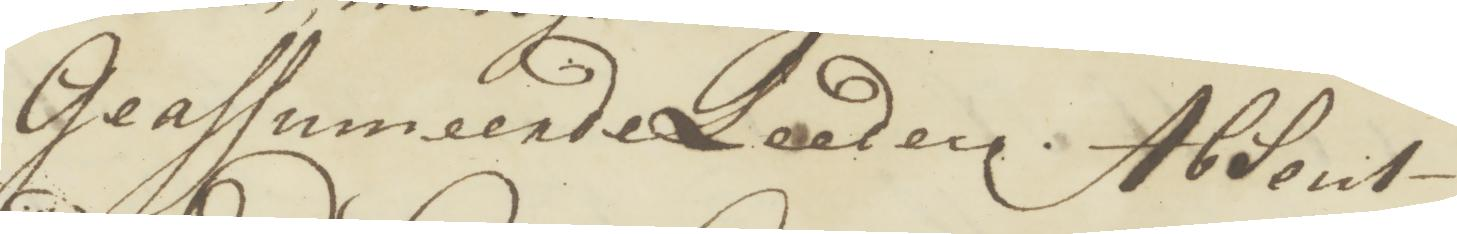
Geassumeerde Leeden. Absent
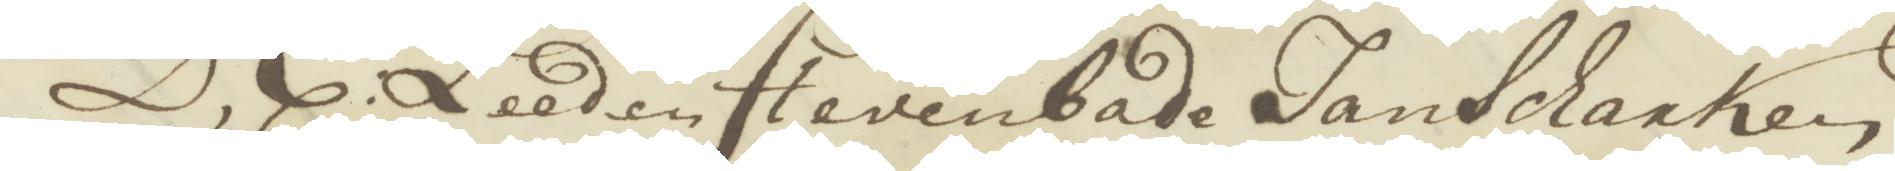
D, E: Leeden Steven bade Ian scharken
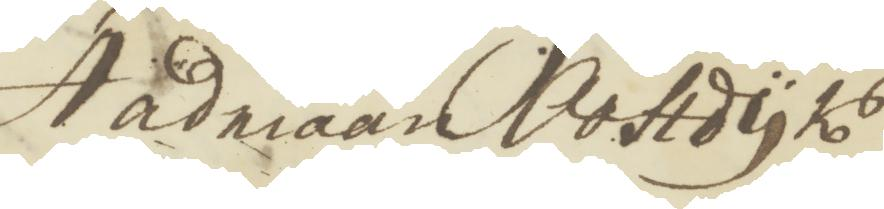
Aadriaan Postdijk
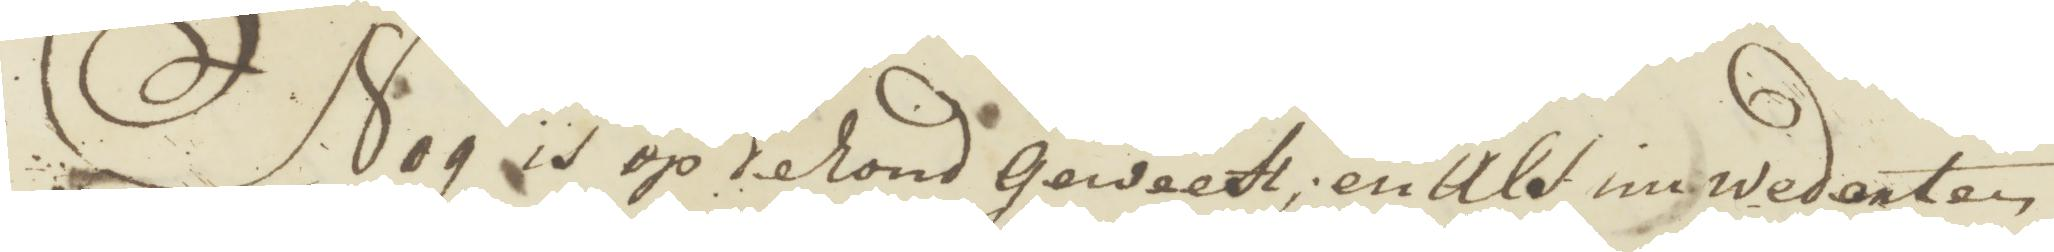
Nog is op de hand geweest; en als nu weder ten
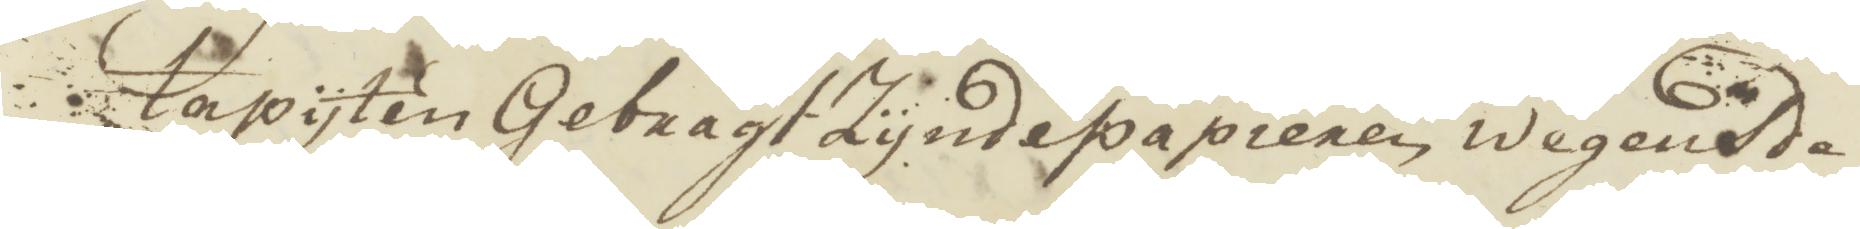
tapijten Gebragt zijnde papieren wegens de
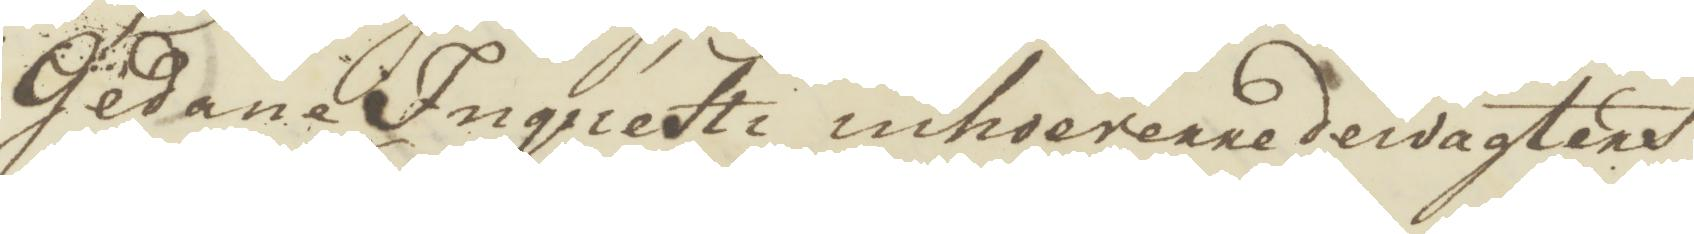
gedane Inquesti inhoeverre dewagters
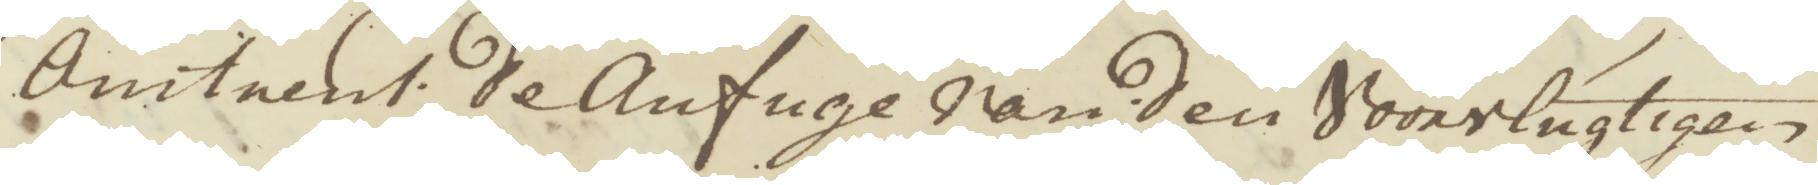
omtrent de Aufuge van den voorvlugtigen
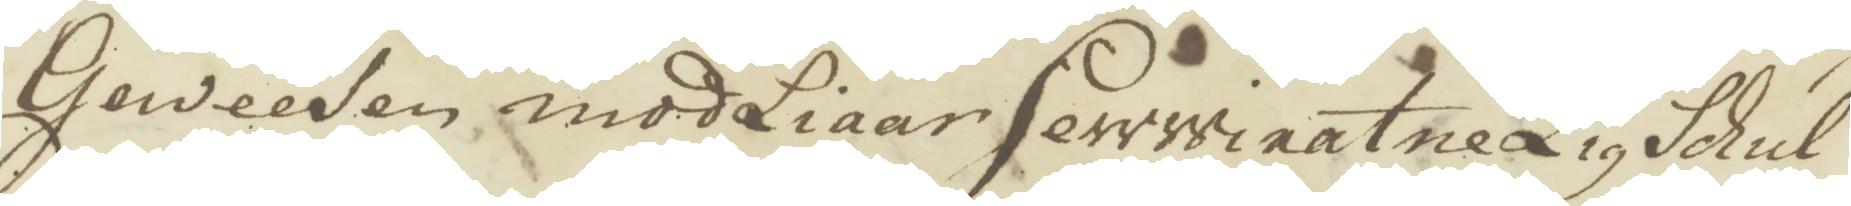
Geweesen modliaar sewwiratne zig schul
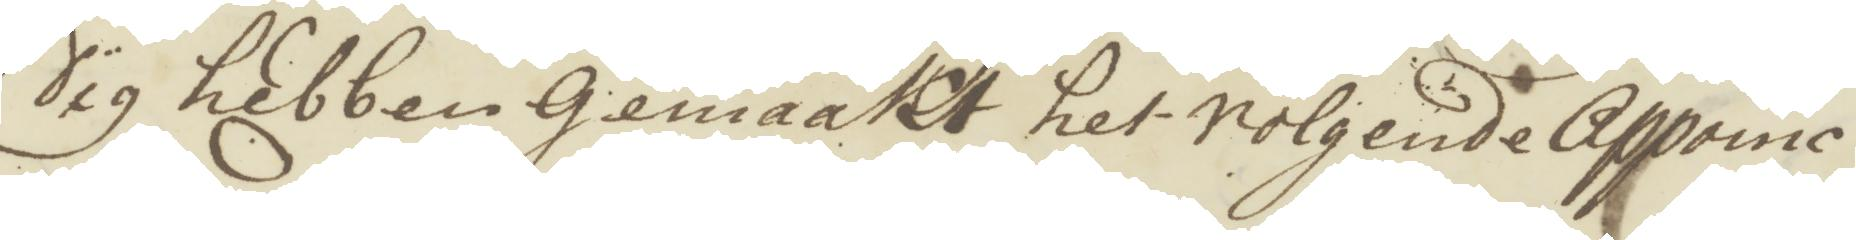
dig hebben gemaakt het volgende Appoinc
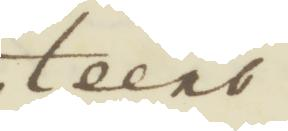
teerd
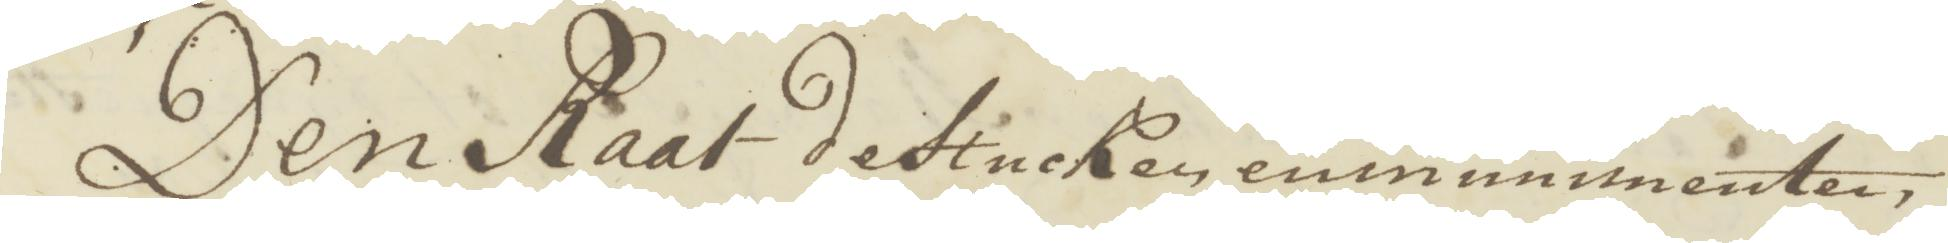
Den Raat de stucken en munimenten
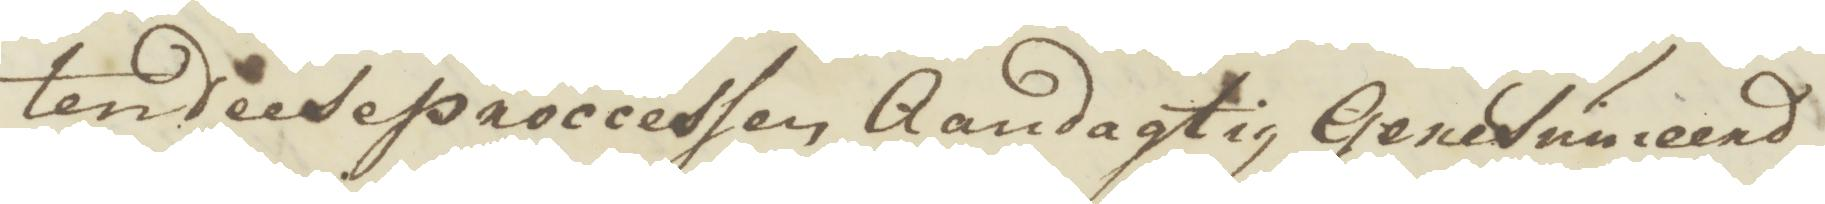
ten deese proccessen aandagtig Geresumeerd
